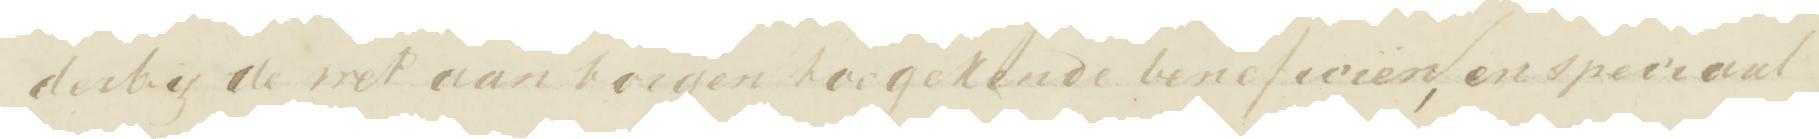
der bij de wet aan borgen toe gekende beneficien en speciaal
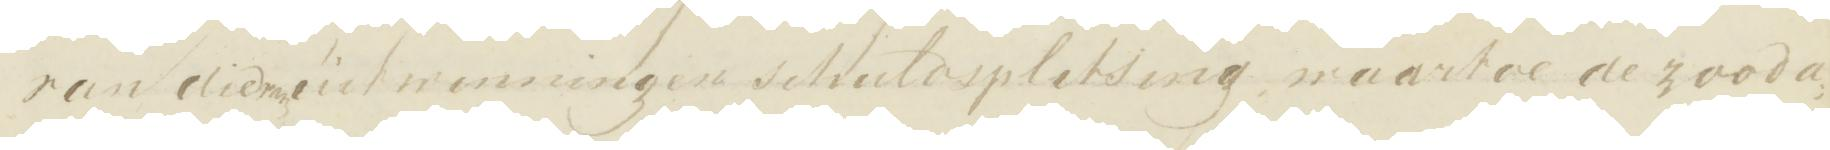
van dien uitwinningen schuldsplitsing waartoe de zooda„
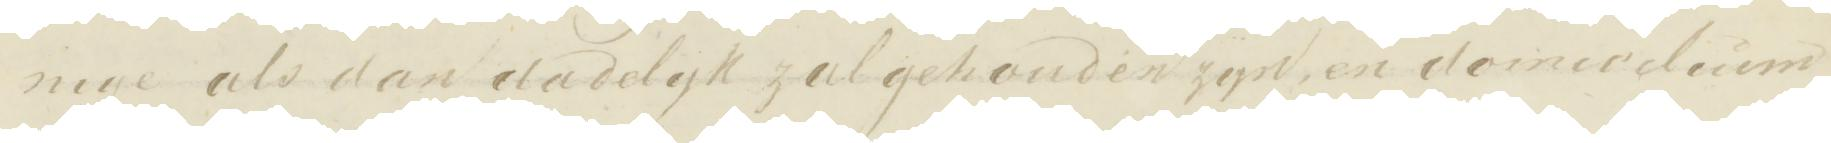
nige als dan dadelyk zal gehouden zijn, en domcilium
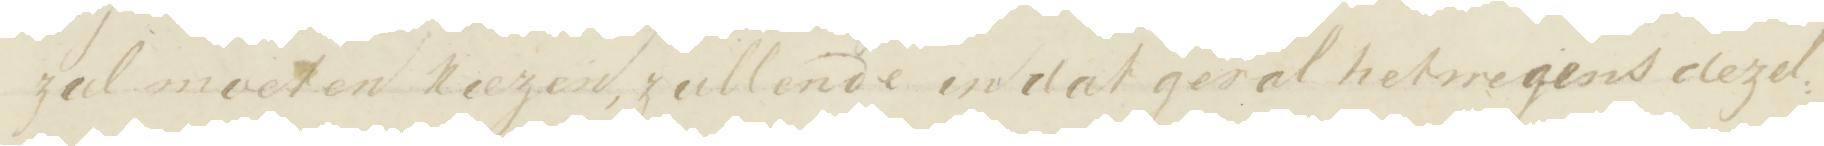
zal moeten kiezen, zullende in dat geval het wegens dezel„
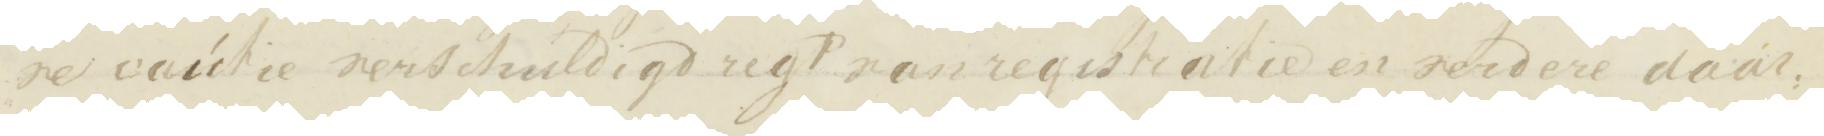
ve cautie verschuldigd regt van registratie en verdere daar„
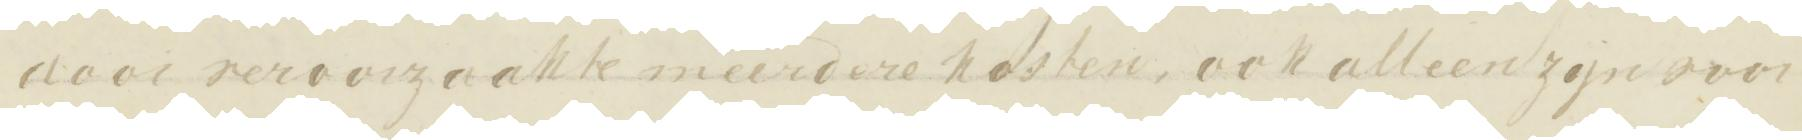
door veroorzaakte meerdere kosten, ook alleen zijn voor
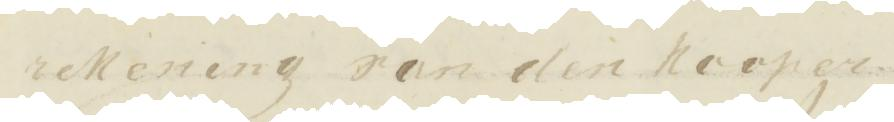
rekening van den kooper
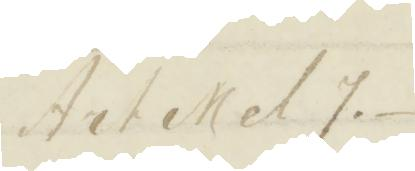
Artikel 7.
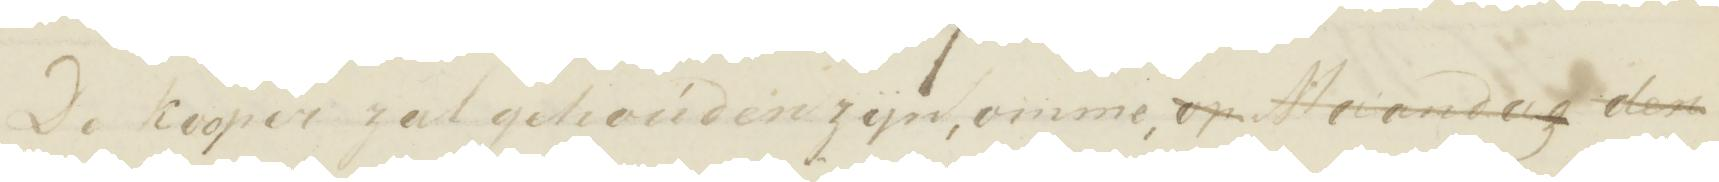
De kooper zal gehouden zijn, omme, op Maandag den
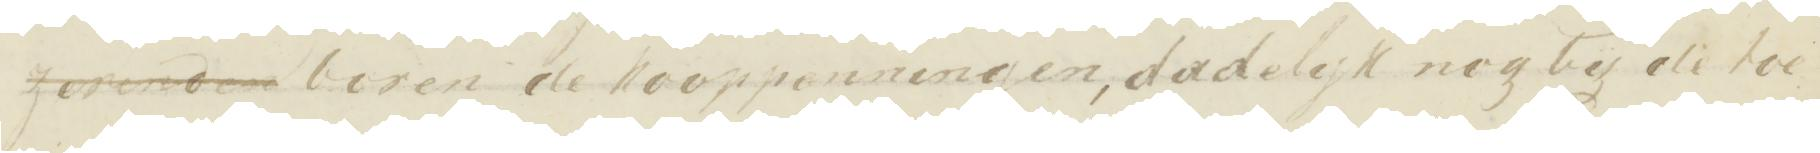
zevenden boven de kooppenningen, dadelijk nog bij de toe
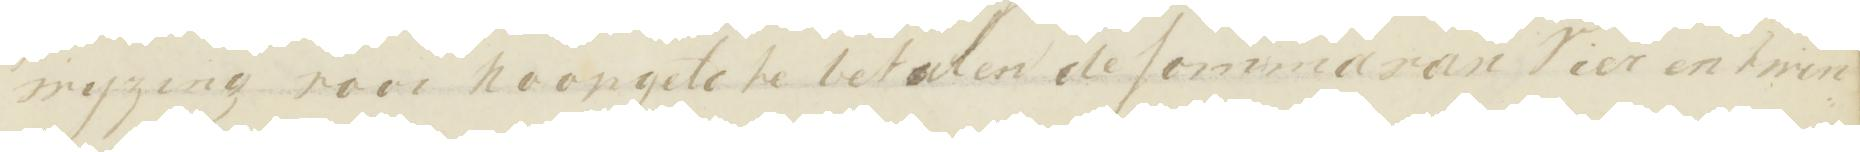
wyzing voor koopgeld te belalen de somma van Vier en twin
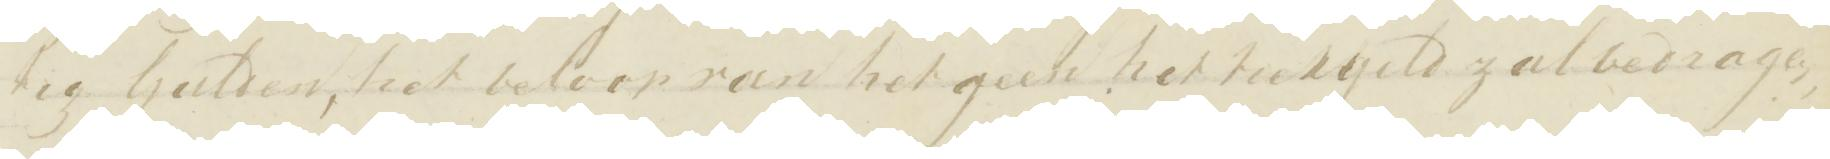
tig Gulden, het beloop van het geen het trekgeld zal bedragen,
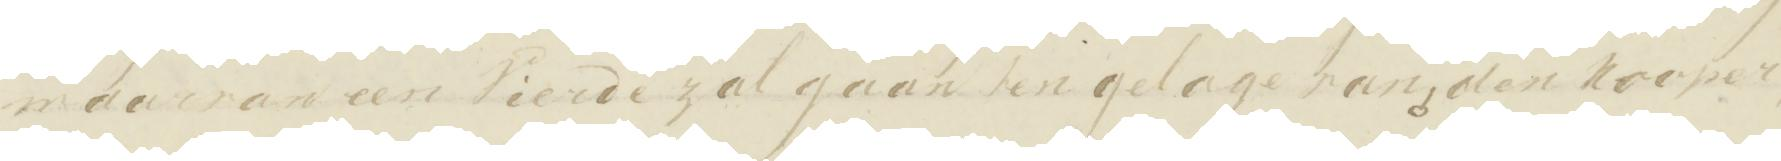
en daarvan een Vierde zal gaan ten gelage van¶ den kooper
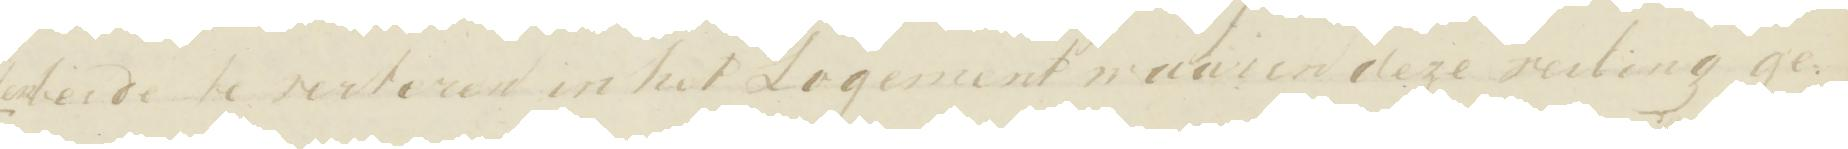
beide te verteren in het Logement waarin deze veiling ge„
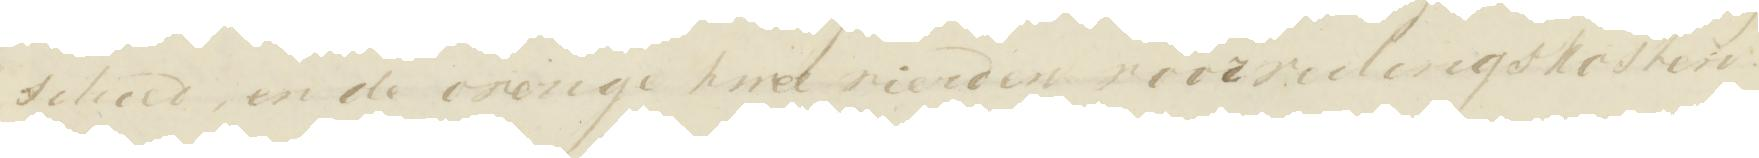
schied, en de overige twee vierden voor veilingskosten.
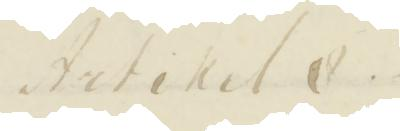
Artikel 8.
